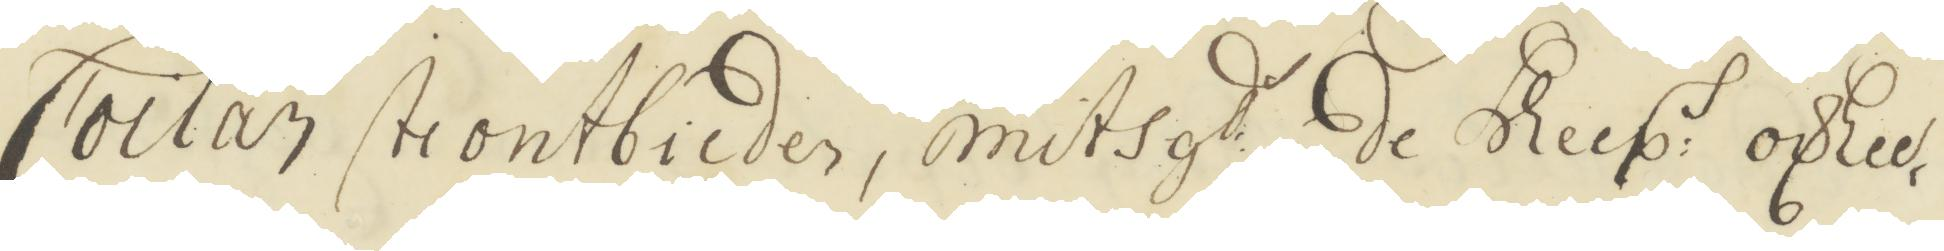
Coilan te ontbieden, mitsgd:s de scheep:s overhee,
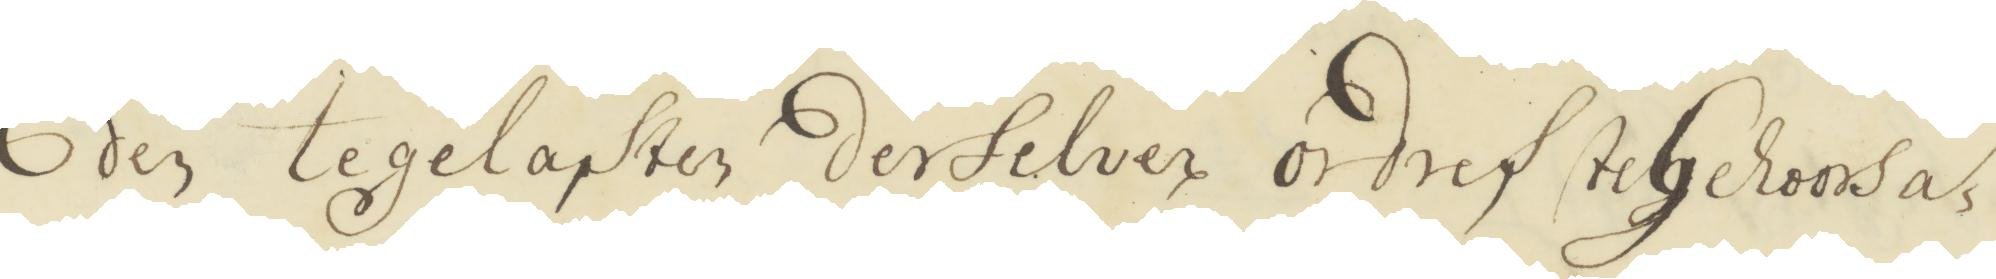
den tegelasten derselver ordres te Gehoorsa„
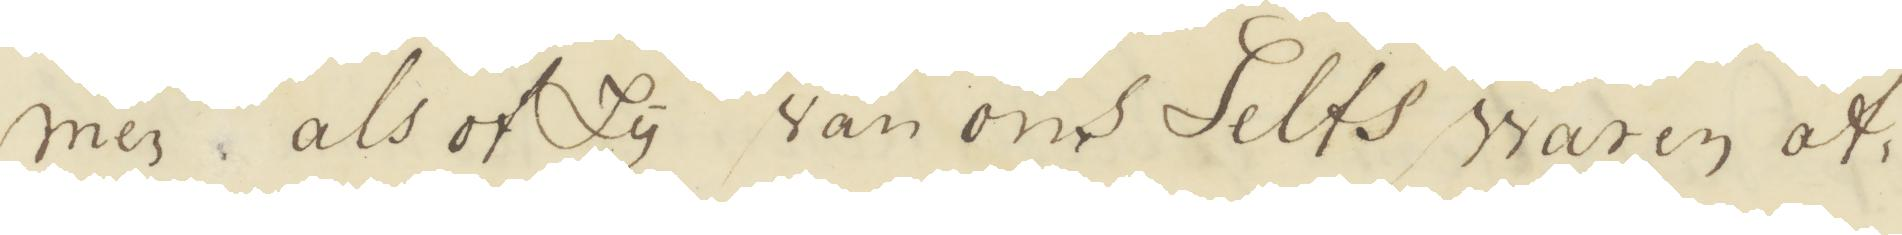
men, als of zij van ons selfs waren af„
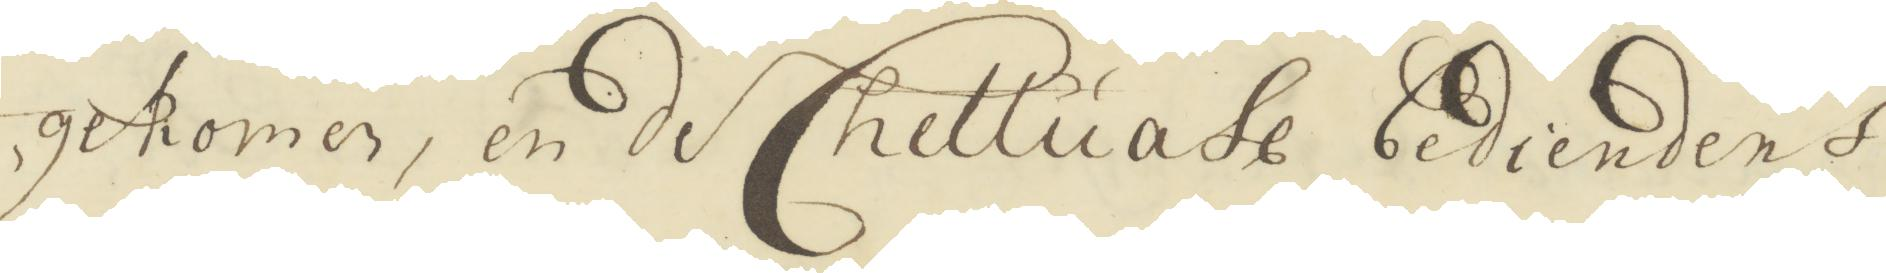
„gekomen, en de Chettuase bediendens
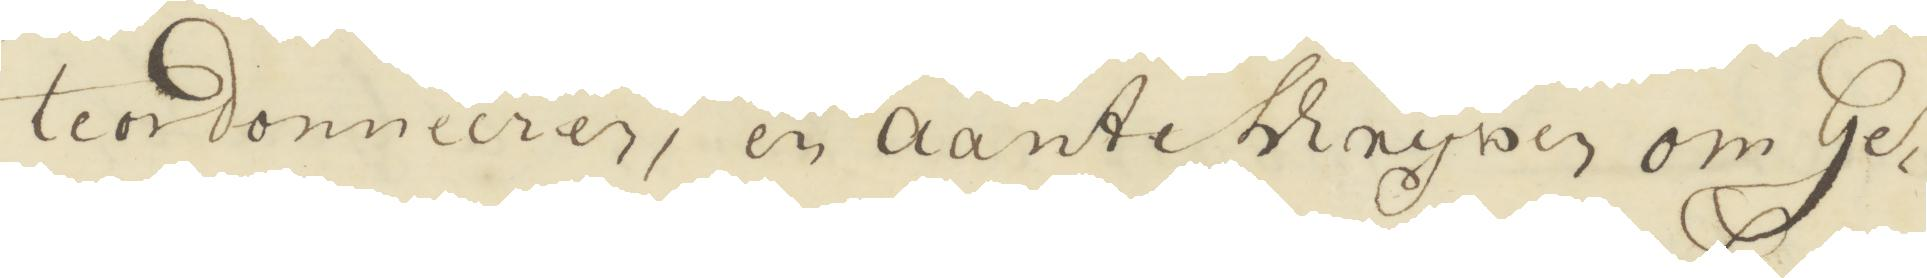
te ordonneeren, en aante schrijven om Ge
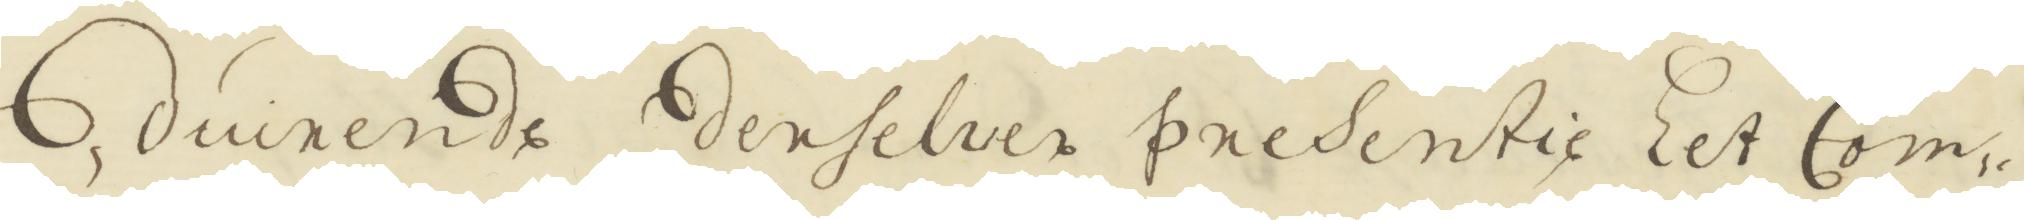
duirende derselver presentie het Com„
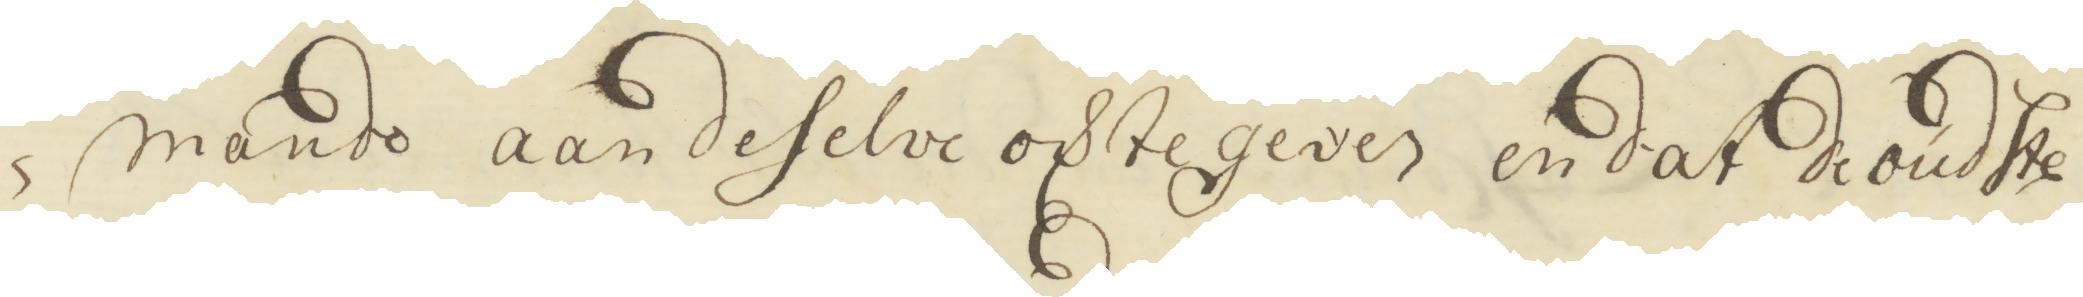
„ mando aan deselve over tegeven en dat de oudste
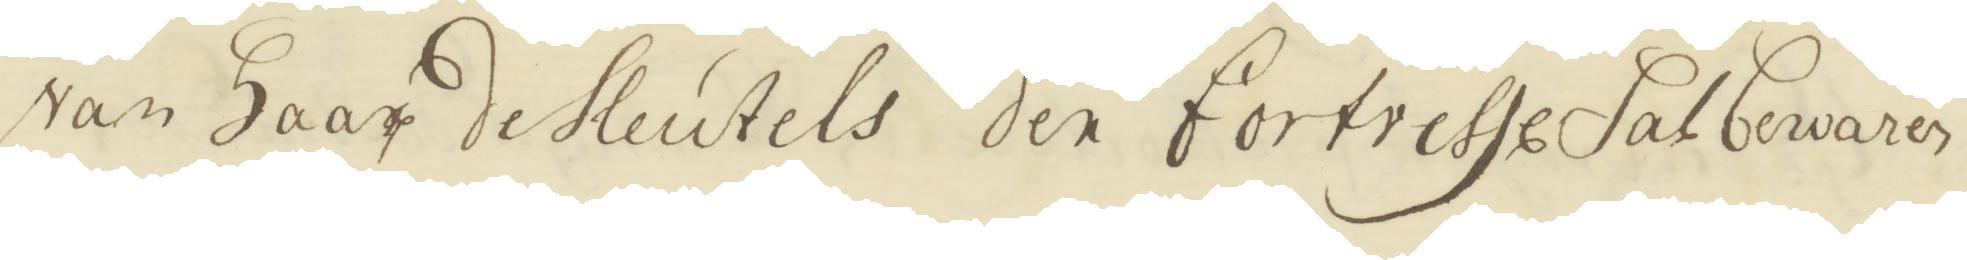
van haar de sleutels der fortresse sal bewaren
